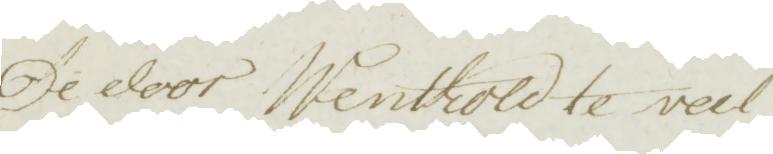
De door Wenthold te veel
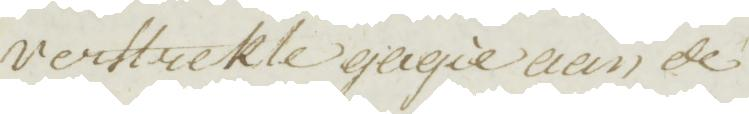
verstrekte gagie aan de
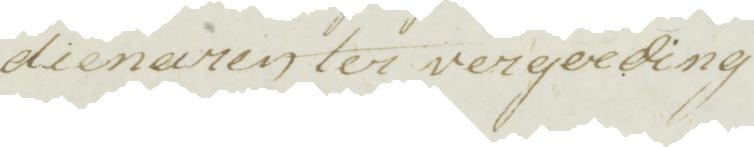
dienaren ter vergoeding
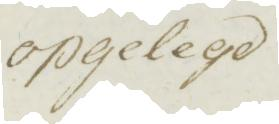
opgelegd
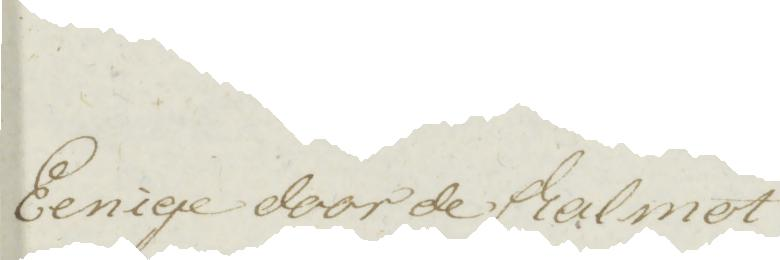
Eenige door de Chalmot
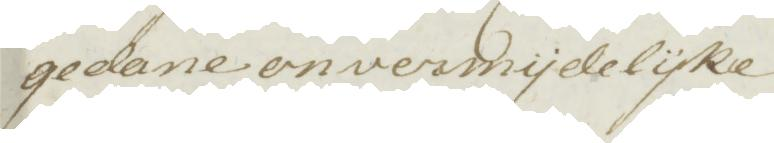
gedane onvermijdelijke
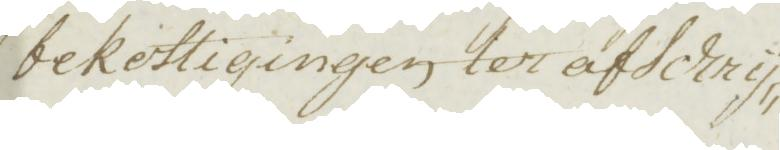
bekostigingen ter afschrij
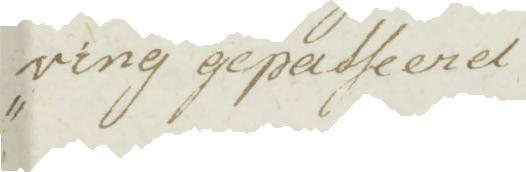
„ving gepasseerd
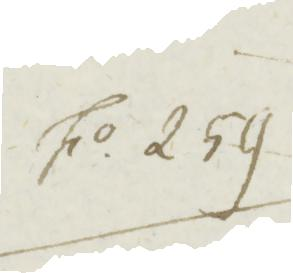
F.o 259
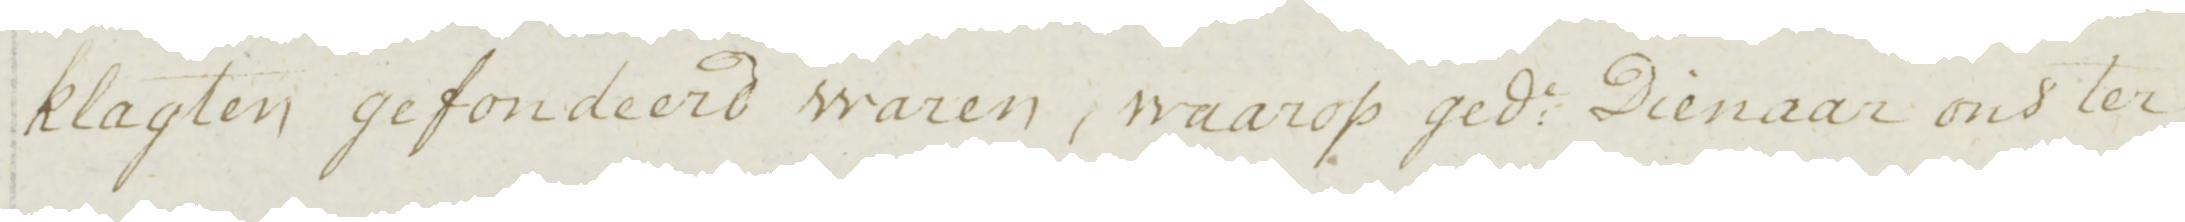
klagten gefondeerd waren, waarop ged:e Dienaar ons ter
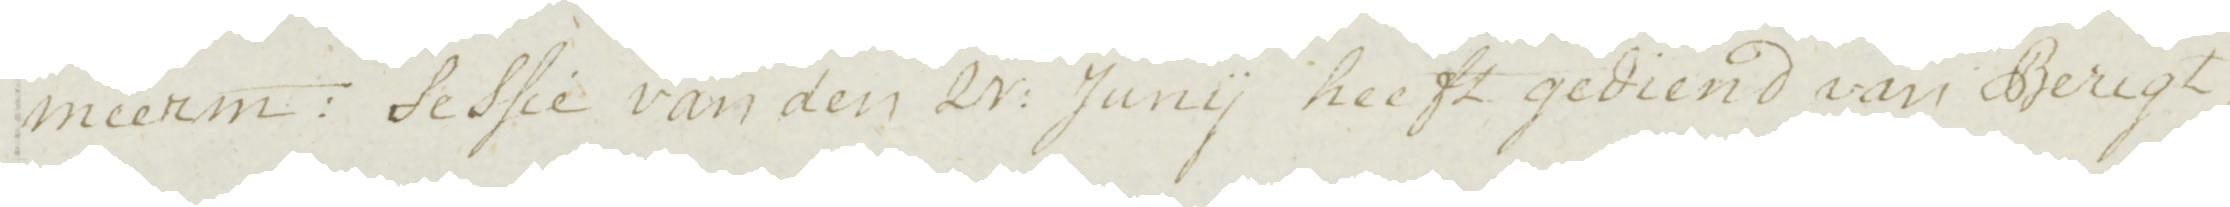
meerm: sessie van den 21: Junij heeft gediend van Berigt
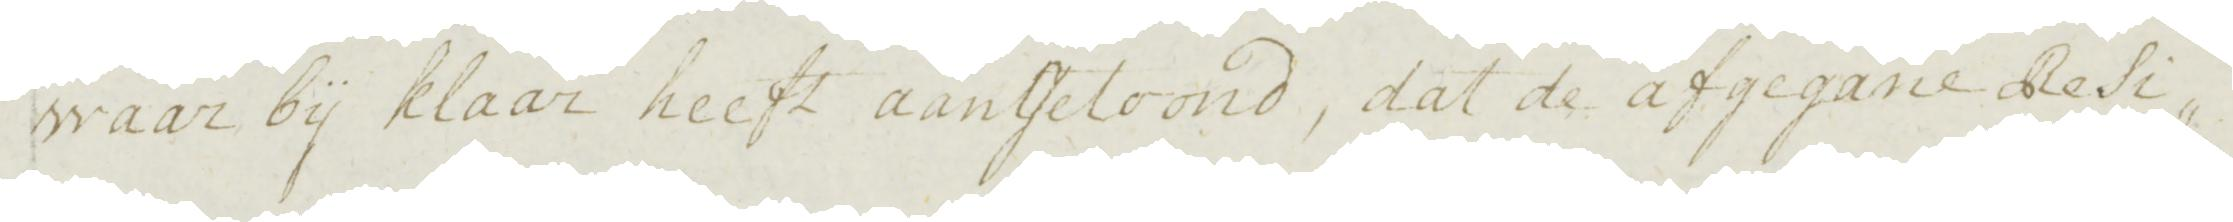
waar bij klaar heeft aangetoond, dat de afgegane Resi„
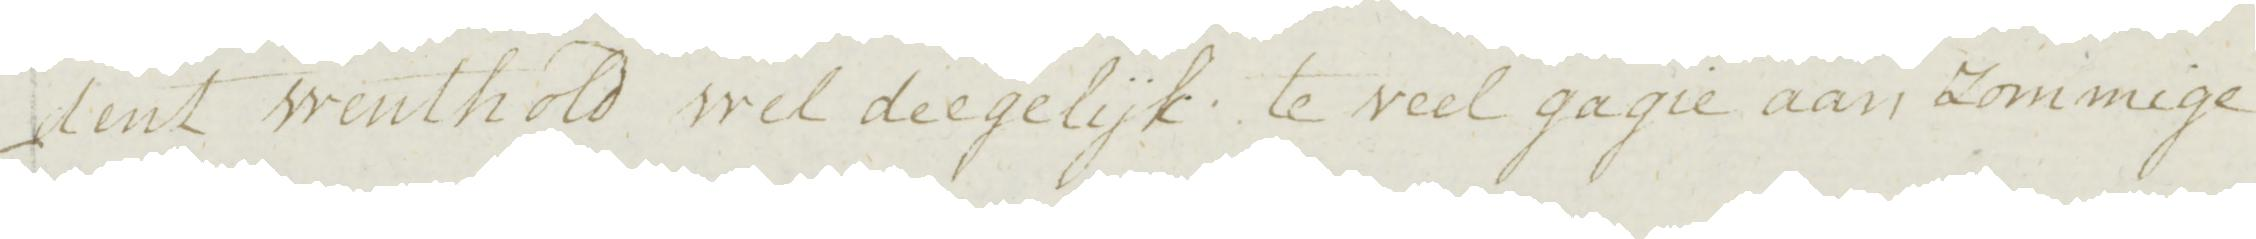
dent wenthold wel deegelijk te veel gagie aan zommige
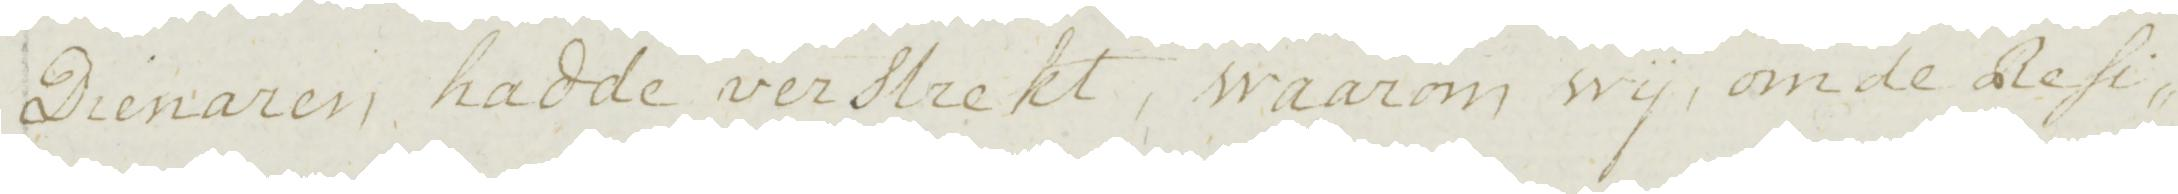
Dienaren hadde verstrekt, waarom wij, om de Resi„
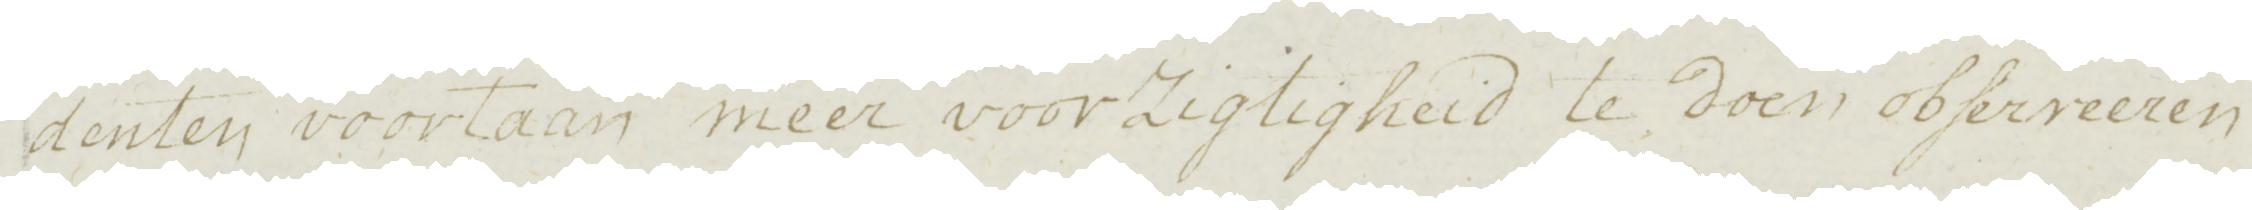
denten voortaan meer voorzigtigheid te doen observeeren
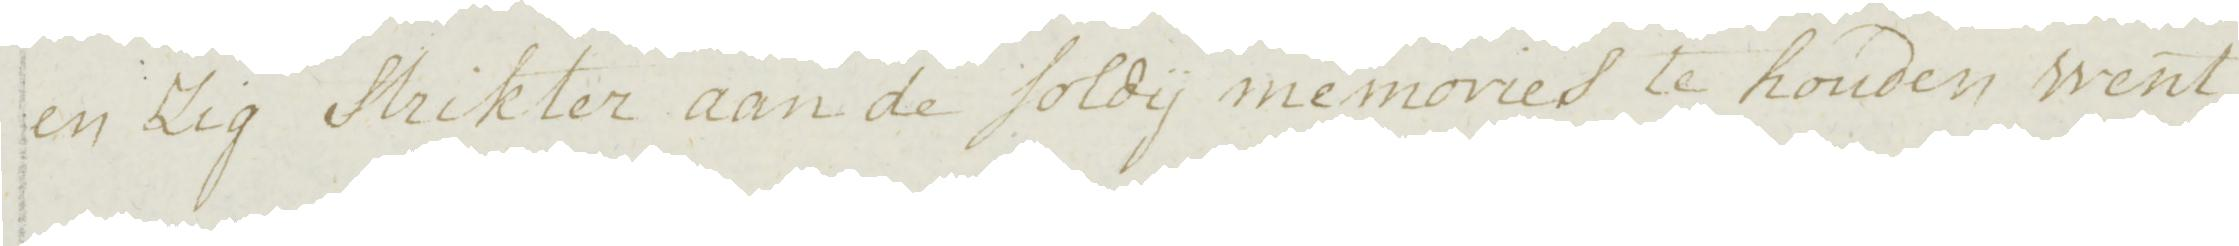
en zig strikter aan de soldij memories te houden went
